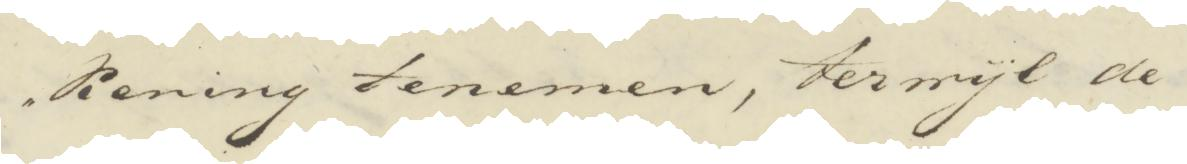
„kening tenemen, terwijl de
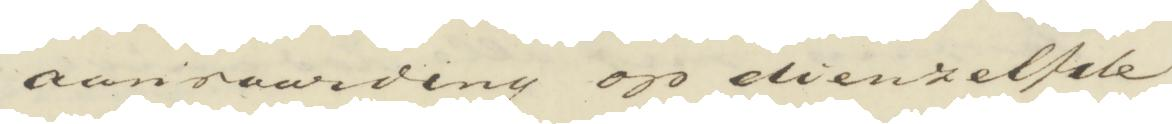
aanvaarding op dienzelfde
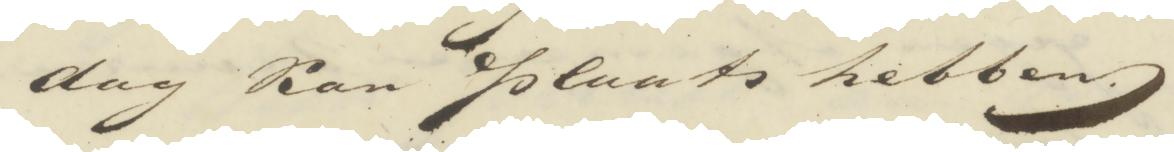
dag kan Plaats hebben.
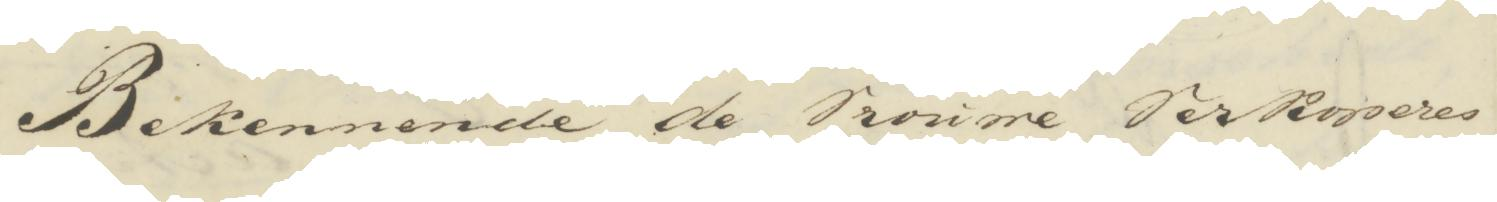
Bekennende de Vrouwe Verkoperes
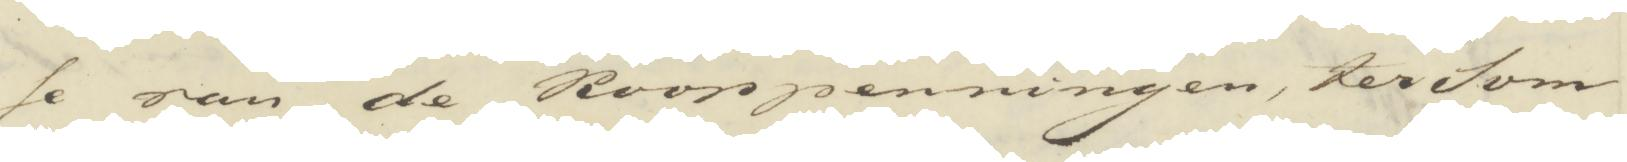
se van de kooppenningen, ter som
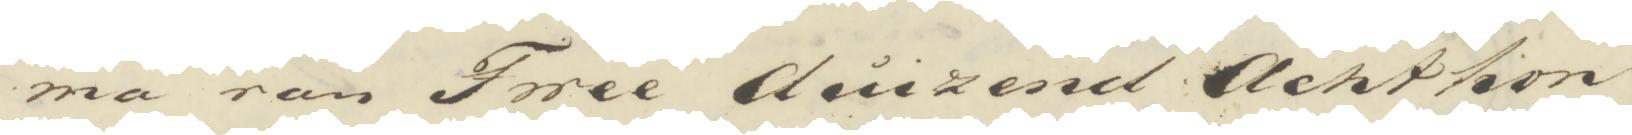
ma van Twee Duizend Achthon
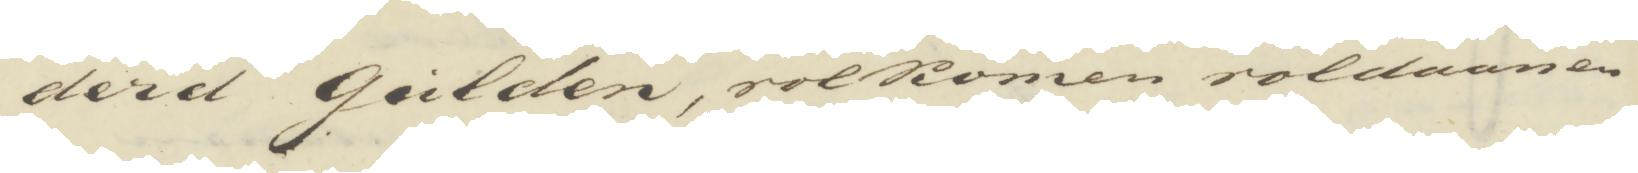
derd Gulden, volkomen voldaan en
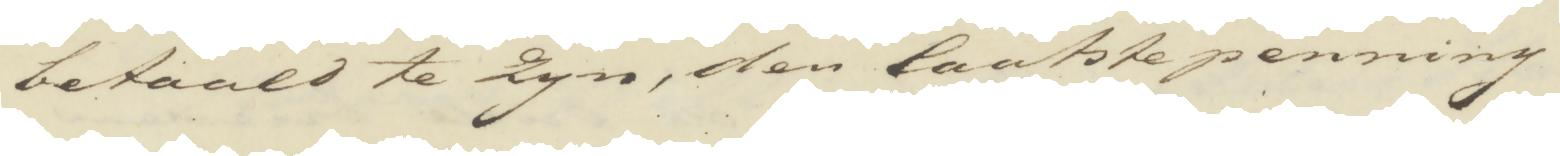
betaald te zyn, den laatste penning
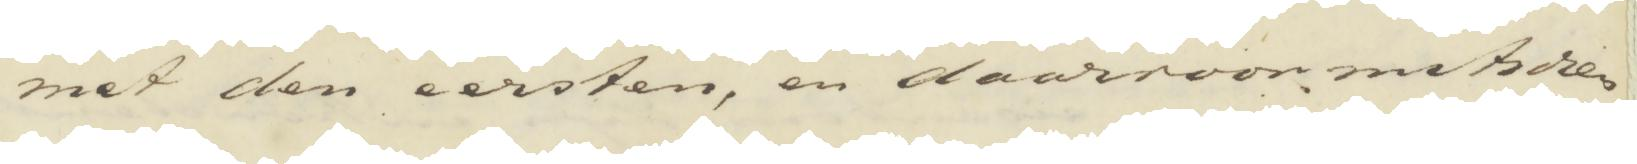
met den eersten, en daarvoor mitsdien
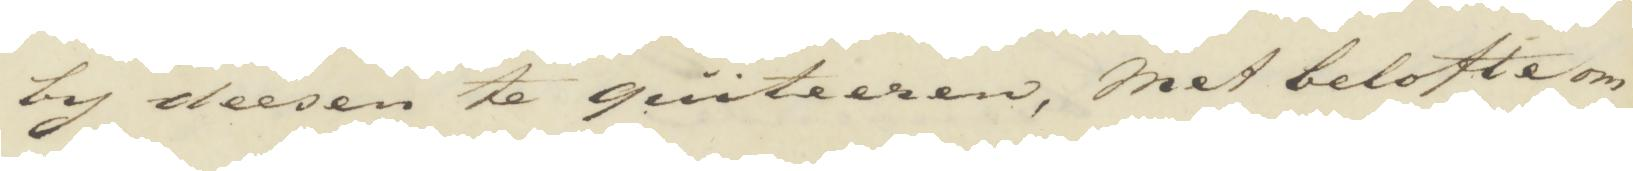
by deesen te quiteeren, met belofte om
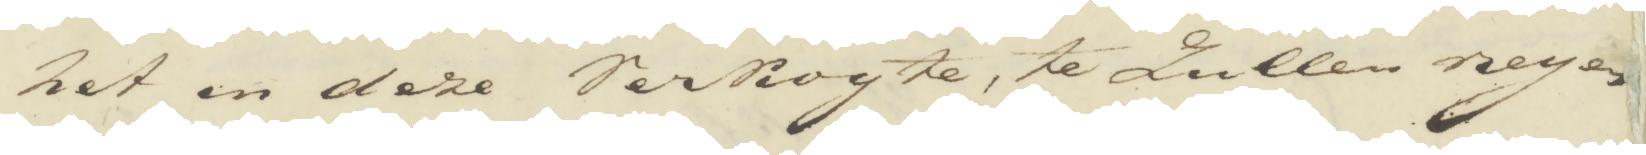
het in deze verkogte, te zullen vreyen
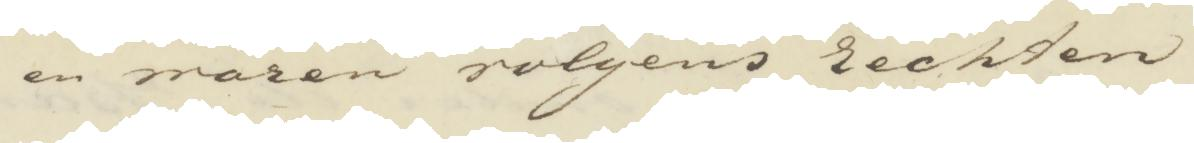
en waren volgens rechten
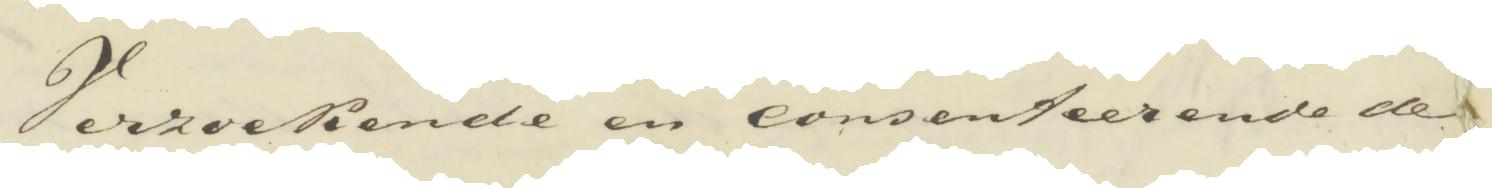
Verzoekende en consenteerende de
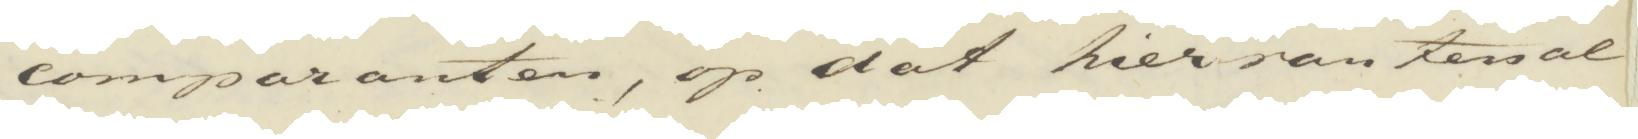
comparanten, op dat hier van ten al
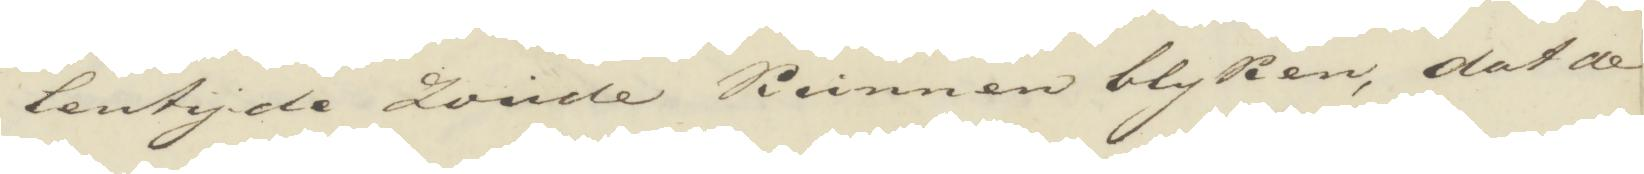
lentijde zoude kunnen blyken, dat de
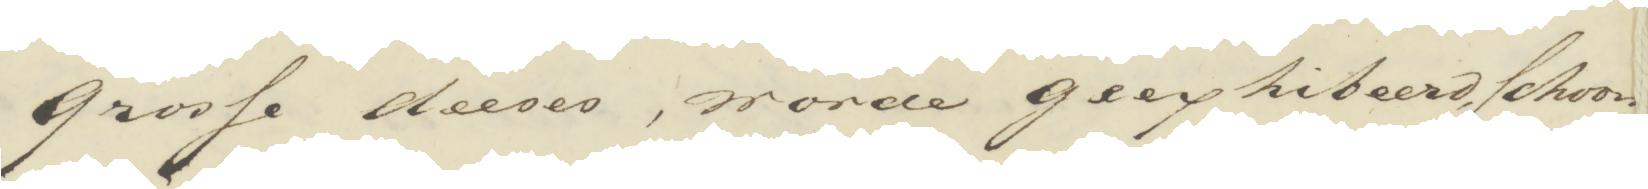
grosse deeses, worde geexhibeerd, schoon
